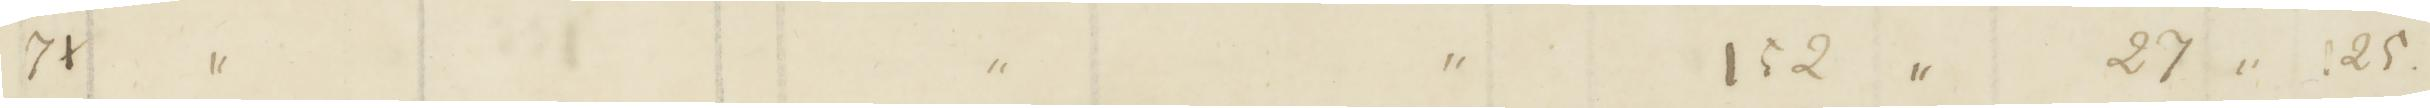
71 „ „ „ 152 „ 27 „ 125.
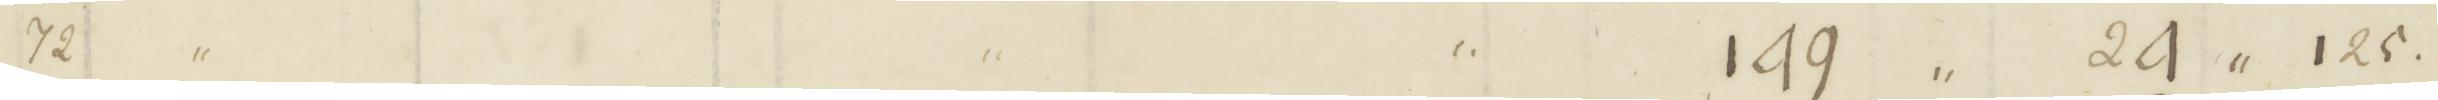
72 „ „ „ 149 „ 24 „ 125.
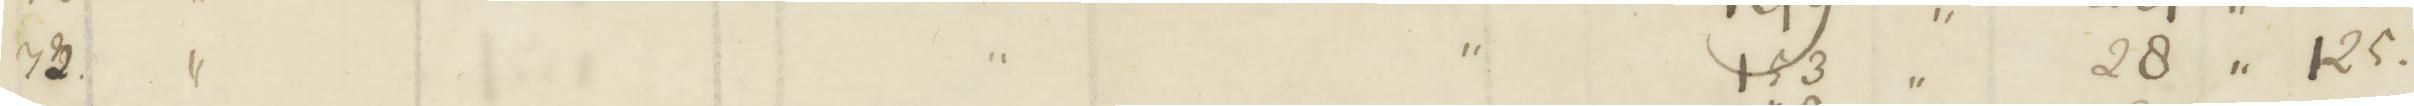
73. „ „ „ 153 „ 28 „ 125.
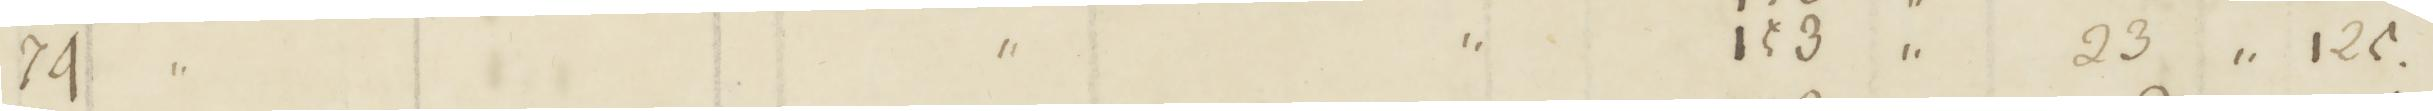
74 „ „ „ 153 „ 23 „ 125.
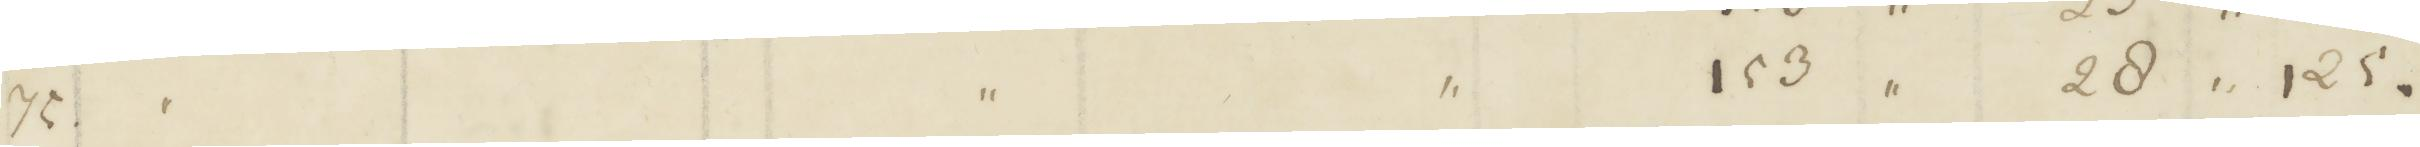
75. „ „ „ 153 „ 28 „ 125.
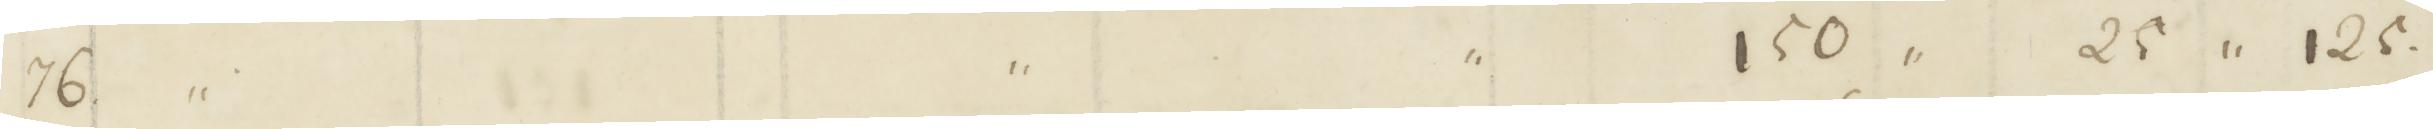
76. „ „ „ 150 „ 25 „ 125.
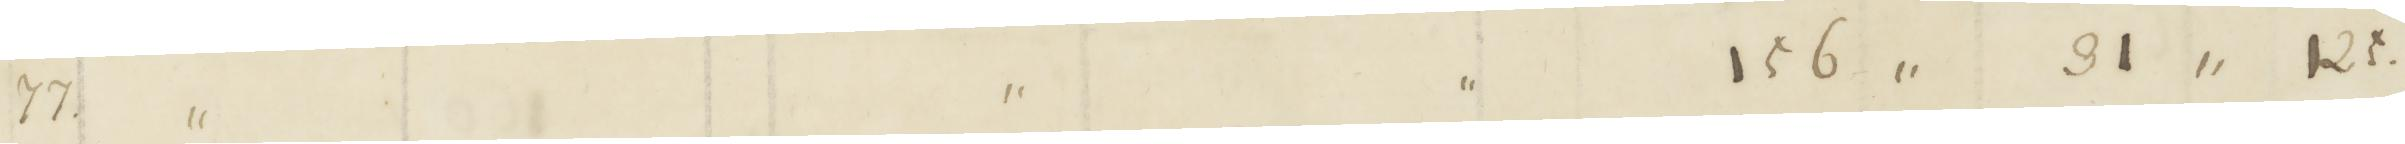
77. „ „ „ 156 „ 31 „ 125.
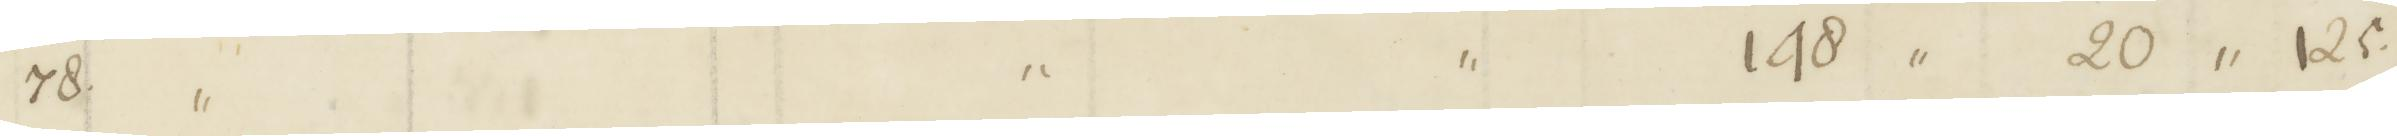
78. „ „ „ 148 „ 20 „ 125.
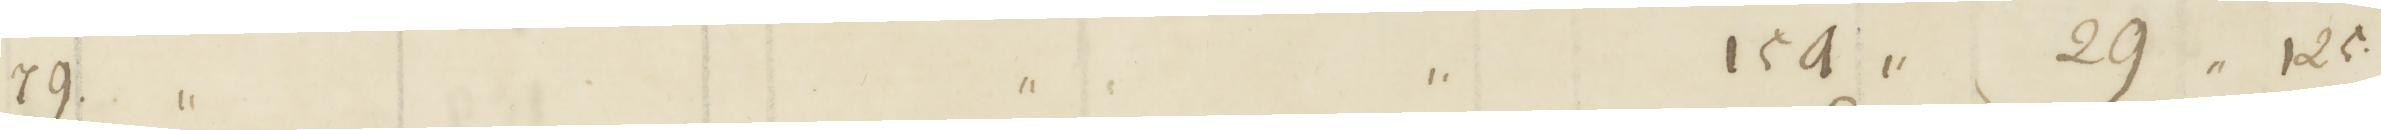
79. „ „ „ 154 „ 29 „ 125.
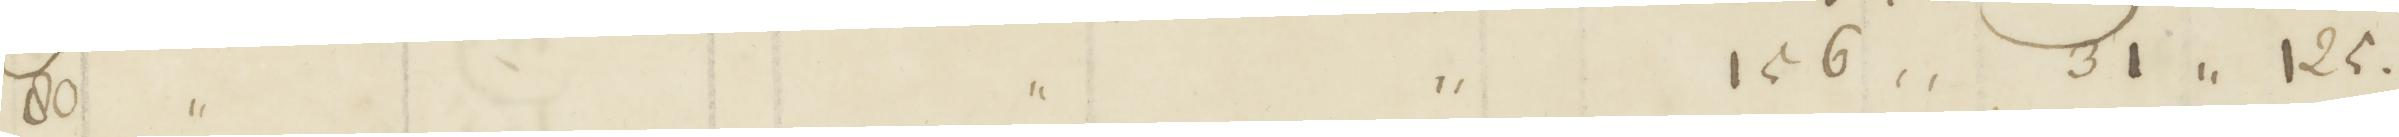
80 „ „ „ 156 „ 31 „ 125.
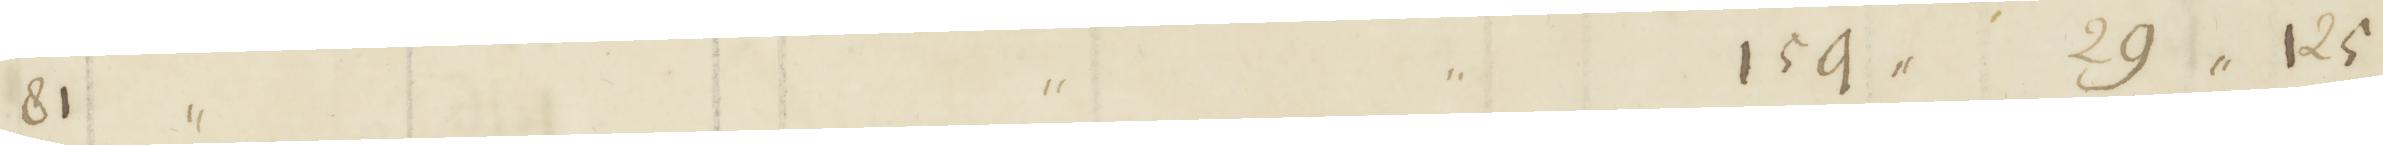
81 „ „ „ 154 „ 29 „ 125
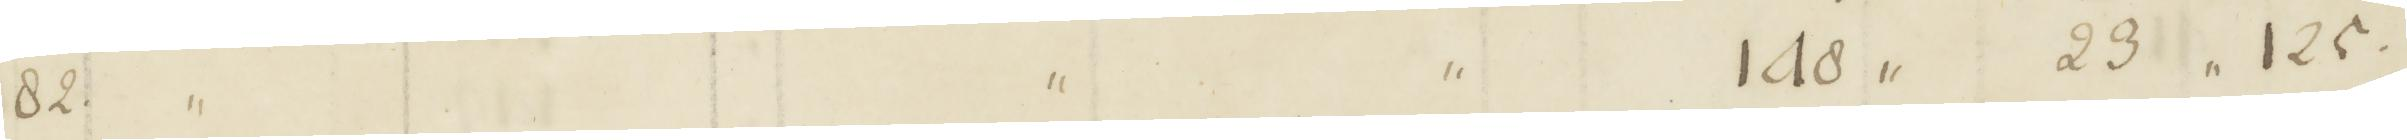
82. „ „ „ 148 „ 23 „ 125.
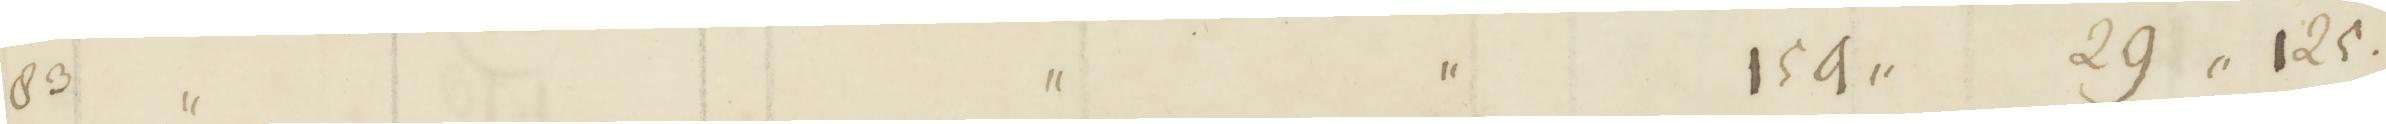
83. „ „ „ 154 „ 29 „ 125.
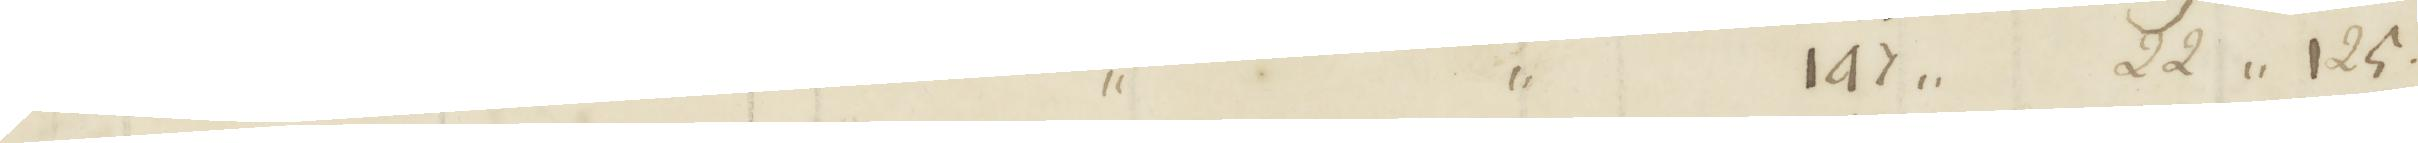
84 „ „ „ 147 „ 22 „ 125.
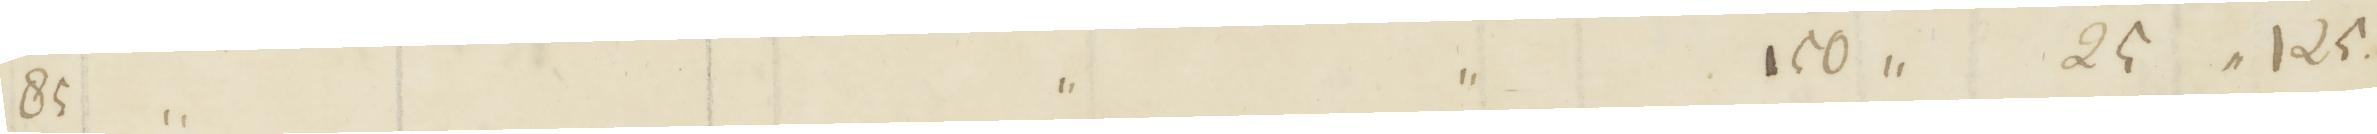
85 „ „ „ 150 „ 25 „ 125.
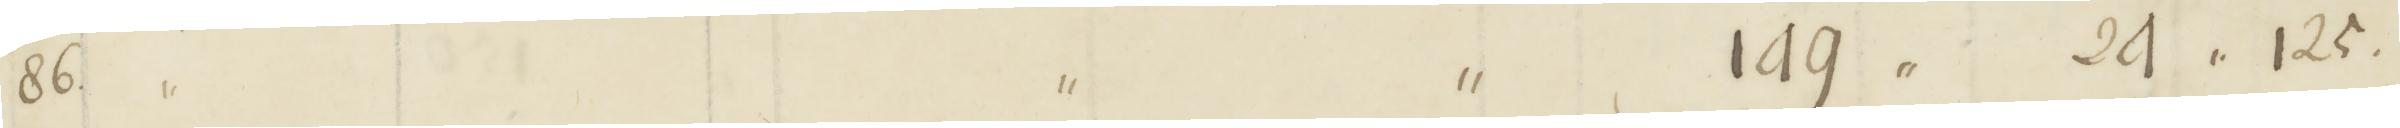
86. „ „ „ 149 „ 24 „ 125.
